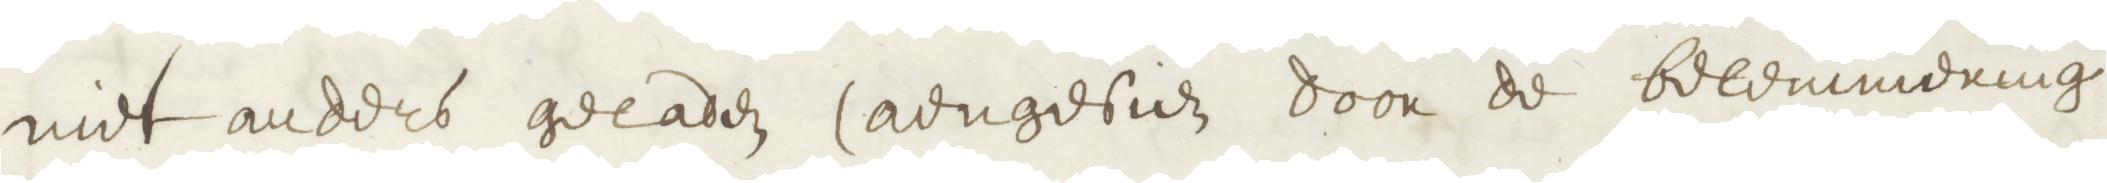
niet anders geladen (aengesien door de belemmering
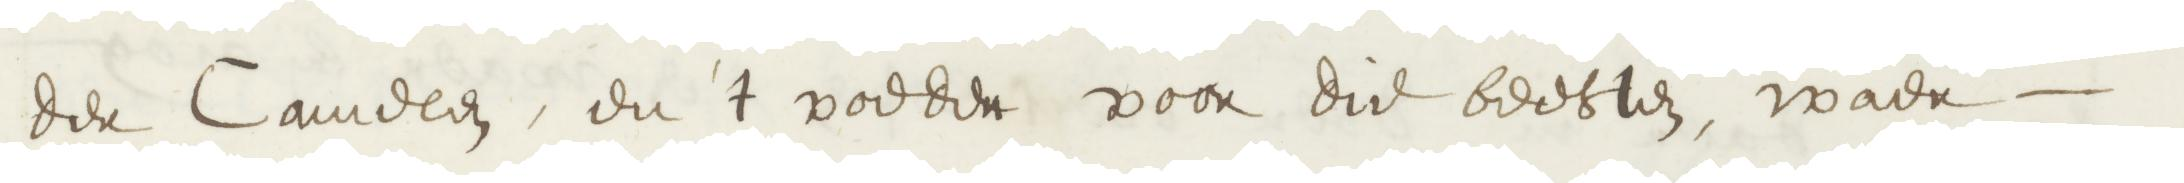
der Camelen, en ’t voeder voor die beesten, waer —
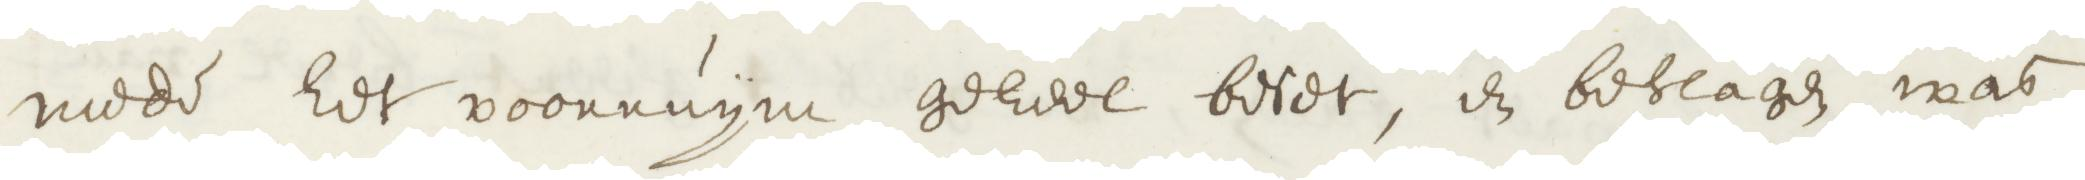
mede het voorruijm geheel beset, en beslagen was,
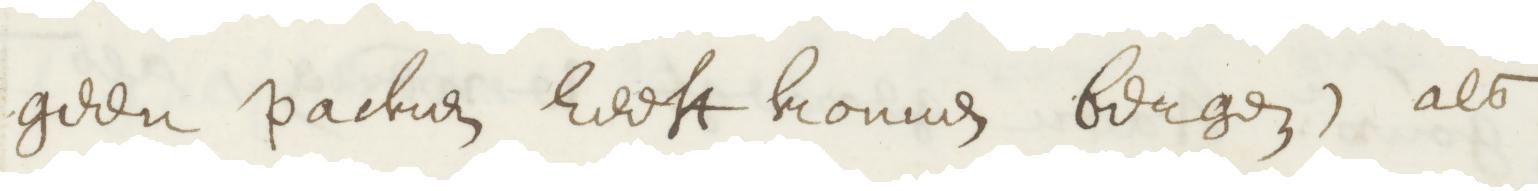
geen packen heeft konnen bergen) als
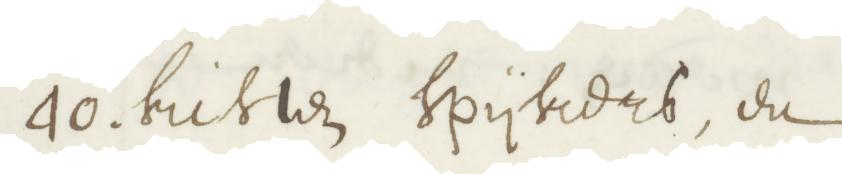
40. kisten spijkers, en
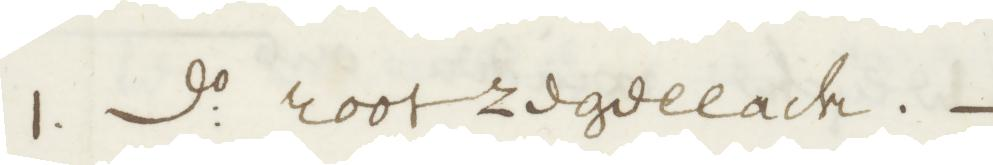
1. D:o root zegellack. —
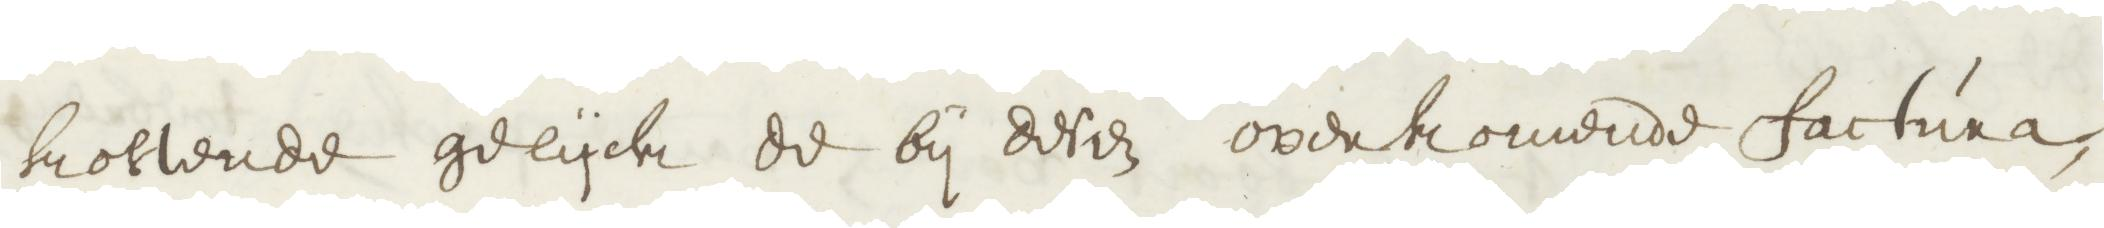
kostende gelijck de bij desen overkomende factura,
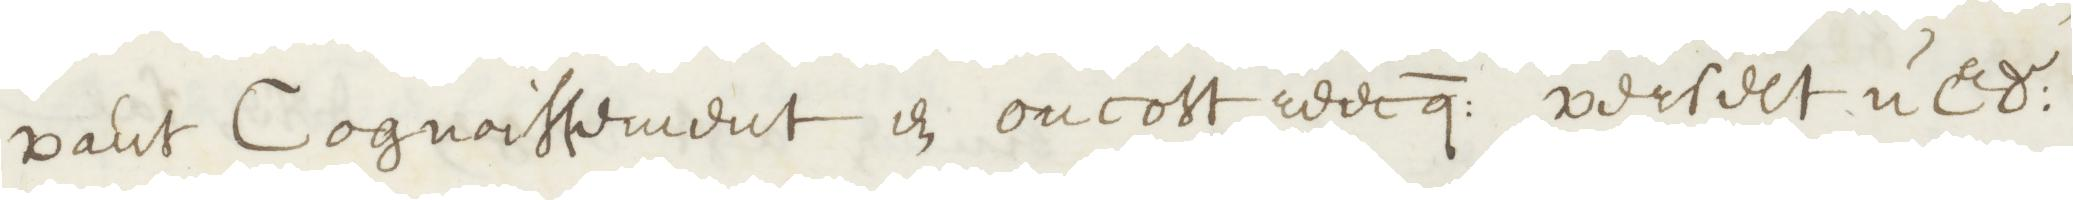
van't Cognoissement en oncost reecq: verselt u Ed:
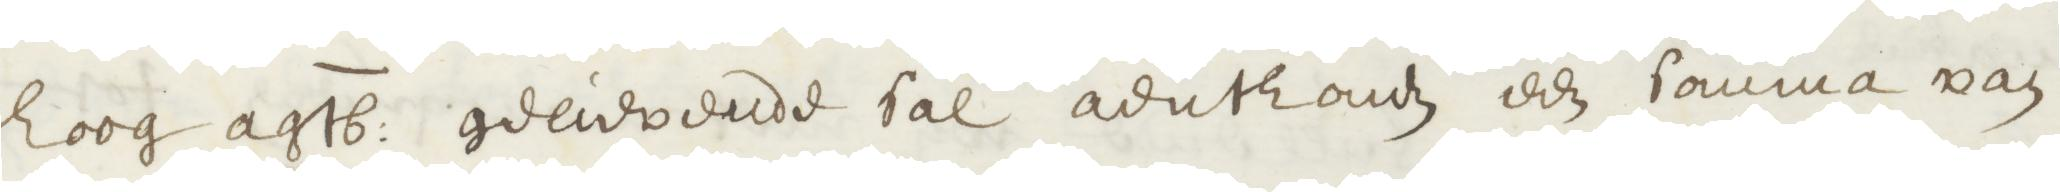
hoog agtb: gelievende sal aenthonen een somma van
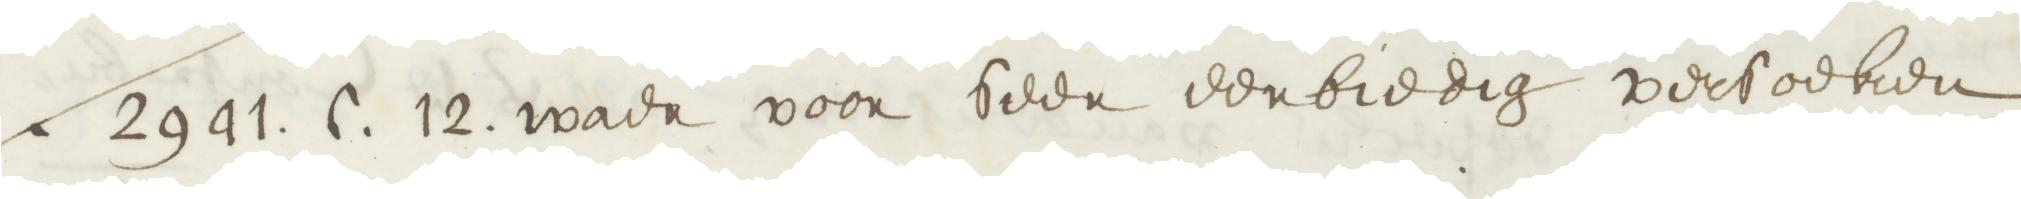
ƒ 2941. 5. 12. waer voor seer eerbiedig versoeken
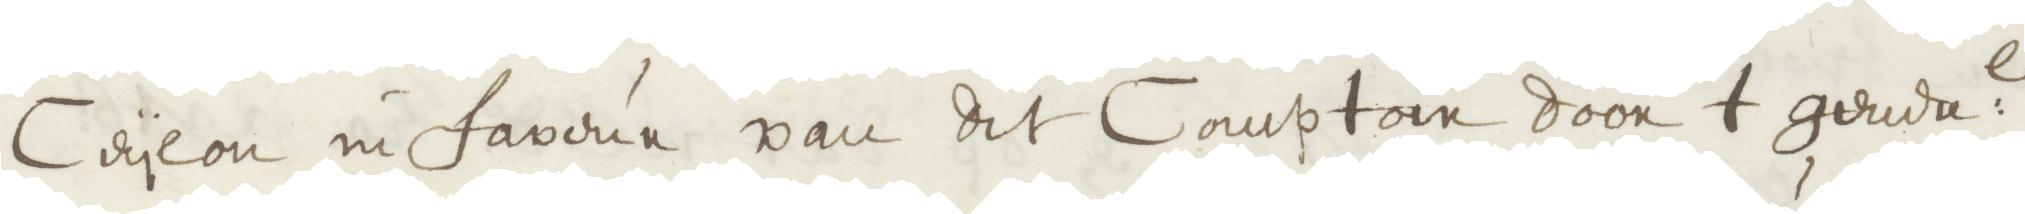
Ceijlon in faveur van dit Comptoir door ’t gener:l
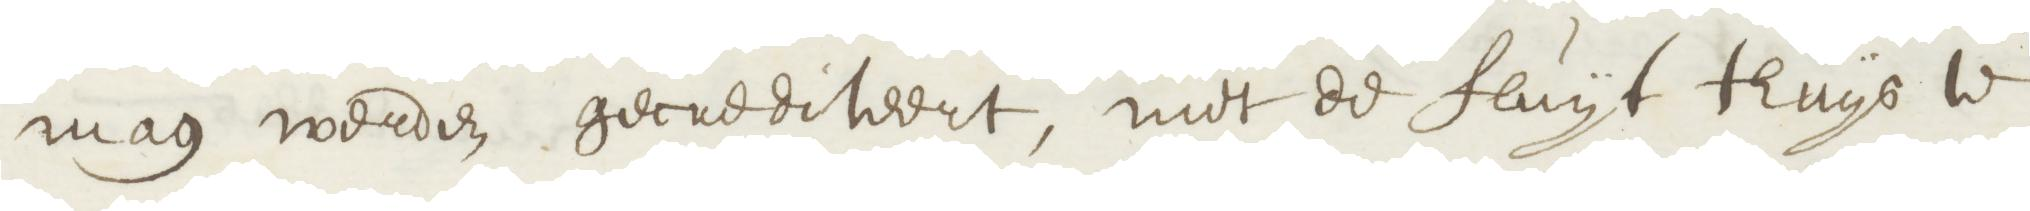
mag werden gecrediteert, met de fluijt thuijs te
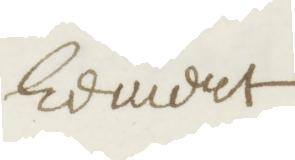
hemert
